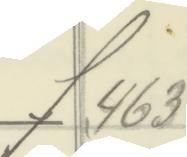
ƒ ,463
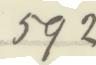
592
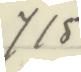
715
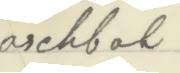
aschbak
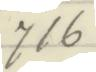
716
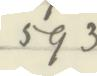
593
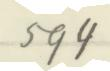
594
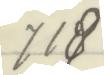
718
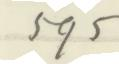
595
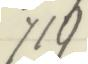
719
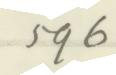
596
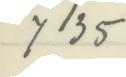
735
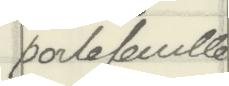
portefeuille
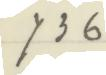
736
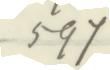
597
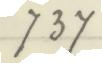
737
